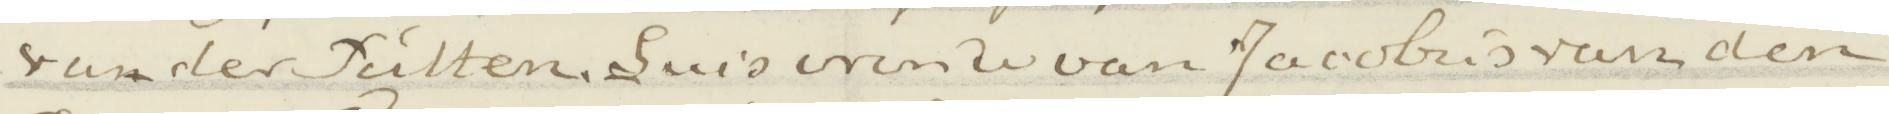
van der Putten, Huisvrouw van Jacobus van den
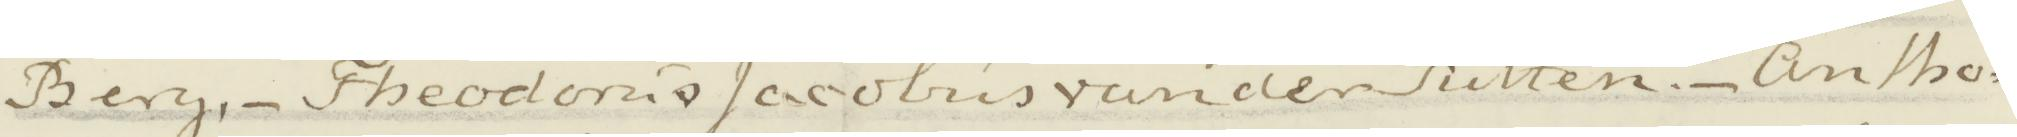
Berg, – Theodorus Jacobus van der Putten. – Antho„
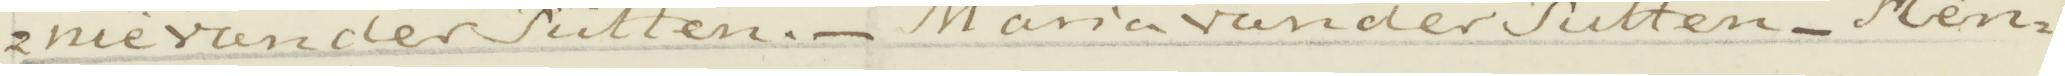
=nie van der Putten. – Maria van der Putten – Hen=
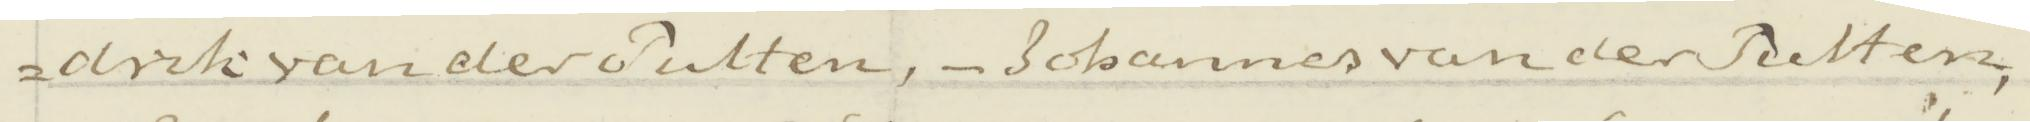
=drik van der Putten, – Iohannes van der Putten,
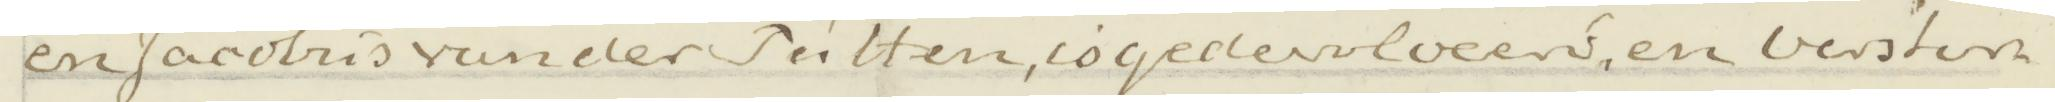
en Jacobus van der Putten, is gedevolveerd, en verstor=
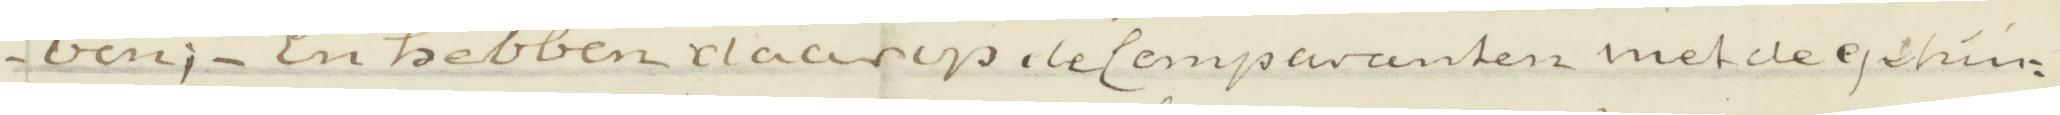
-ven; – En hebben daar op de Comparanten met de getui=
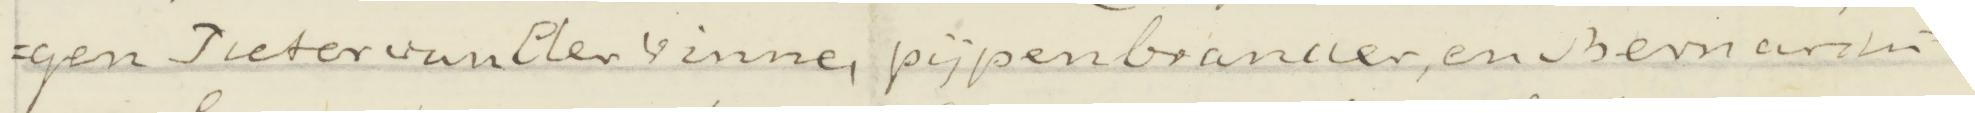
gen Pieter van der vinne, pijpenbrander, en Bernardus
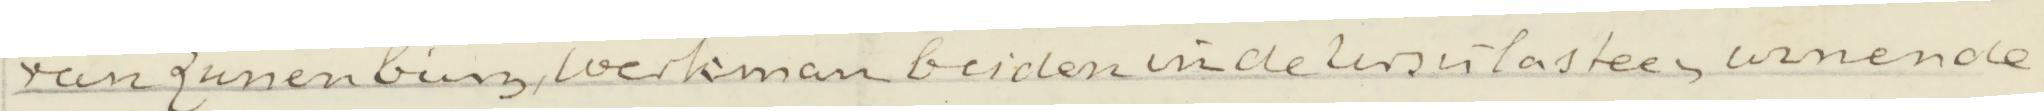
van Lunenburg, werkman beiden in de ursulasteeg wonende
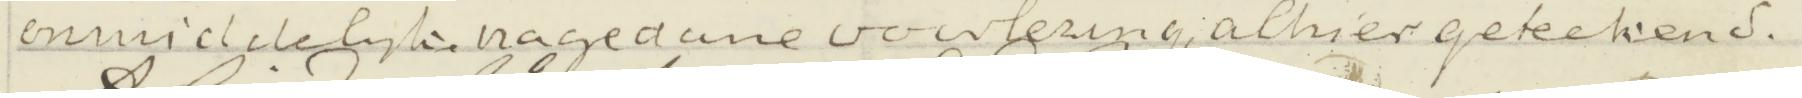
onmiddelyk nagedane voorlezing, alhier geteekend.
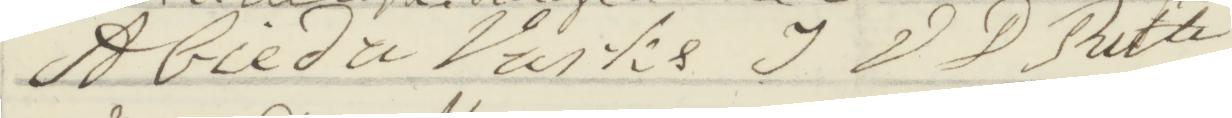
Alida Varks I V D Putte
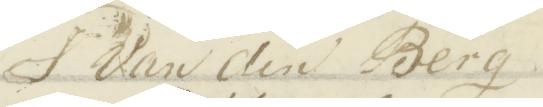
I Van den Berg
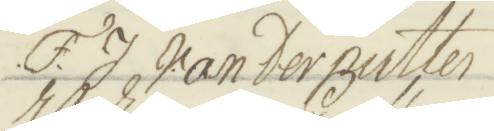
.F. I van der putten
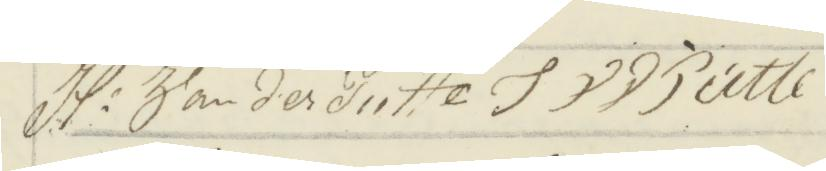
H: Van der Putte I V D Putte
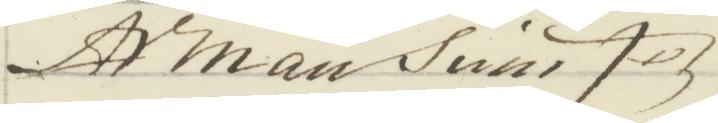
AV Man Sunit
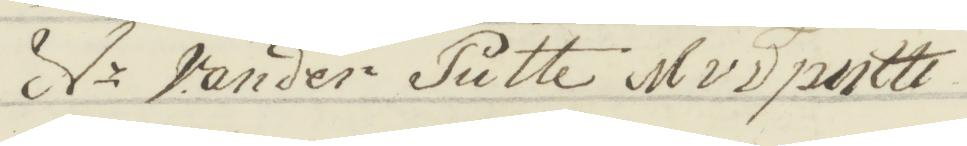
A= Vander Putte M v D putte
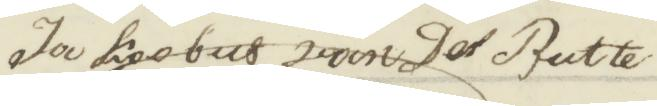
Jakobus van der Putte
